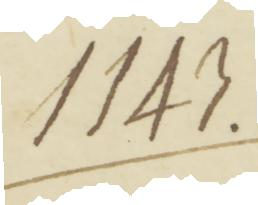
1143.
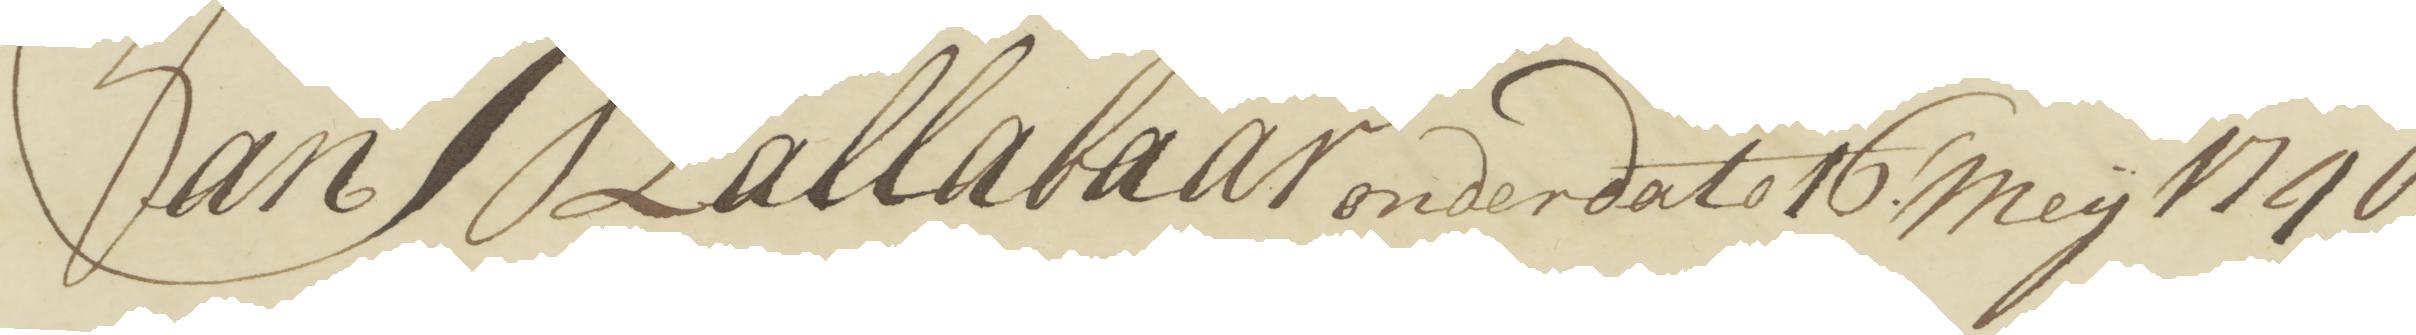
Van Mallabaar onderdato 16.' Meij 1740
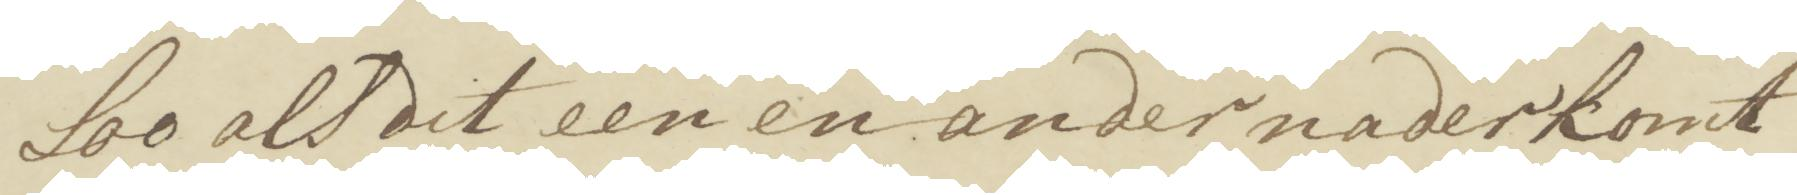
soo als dit een en ander naderkomt
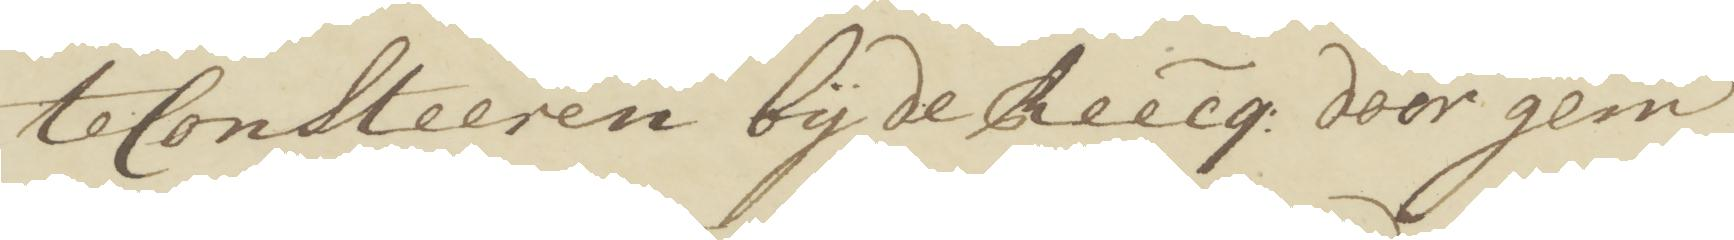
te consteeren bij de Reecq: door gem
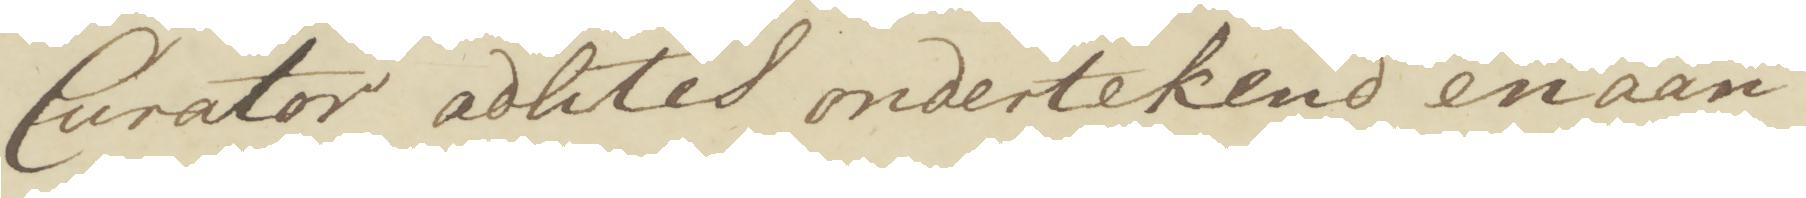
Curator adlites ondertekend en aan
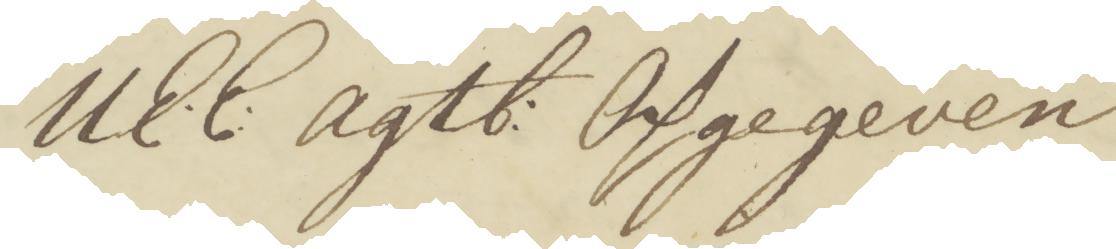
UE. E: agtb: Overgegeven
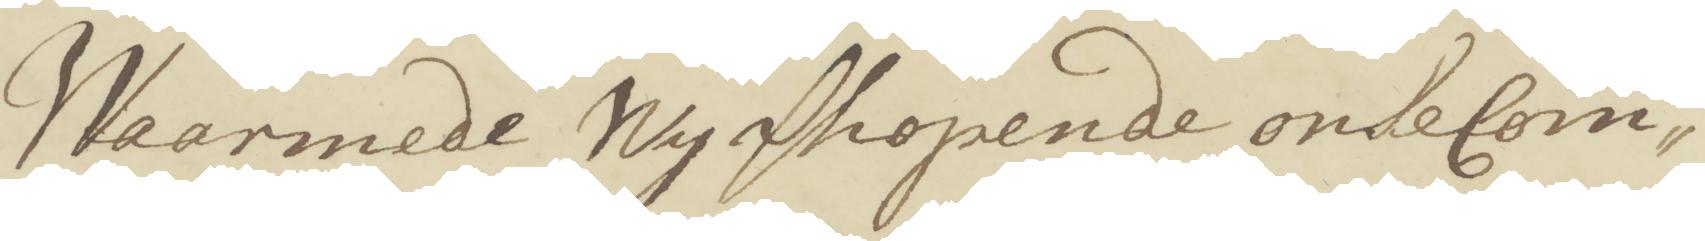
Waarmede wy verhopende onse Com„
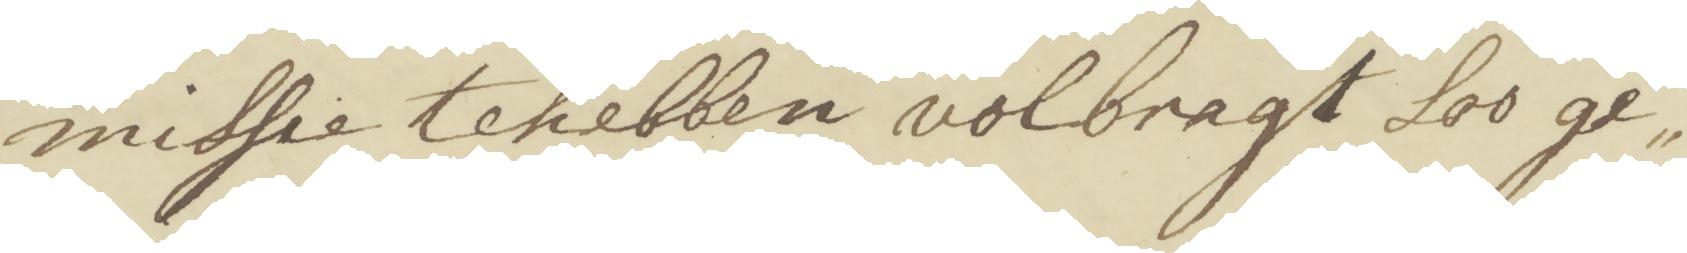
missie tehebben volbragt soo ge„
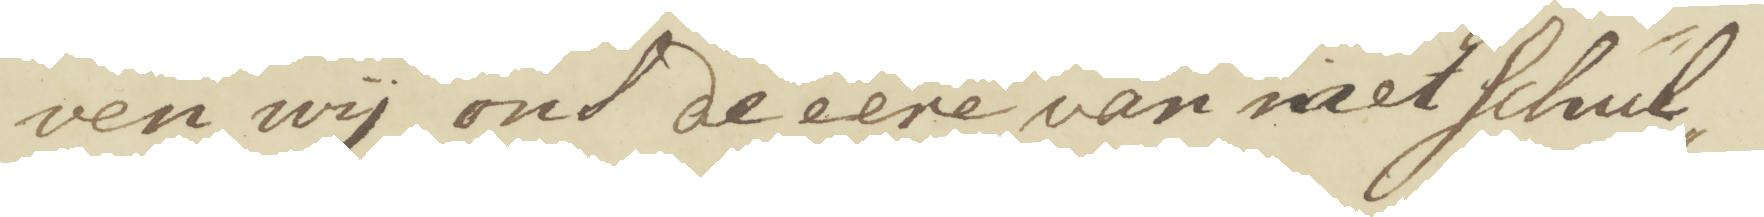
ven wij ons de eere van met schul„
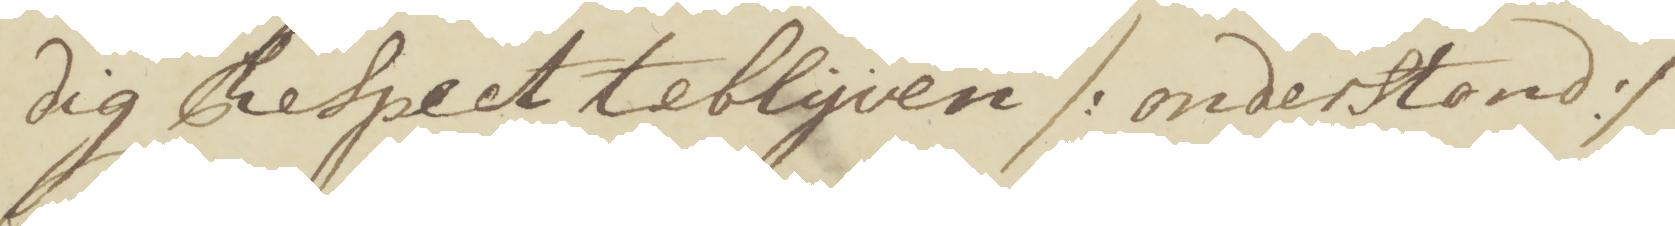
dig Respect te blijven /:onderstond:/
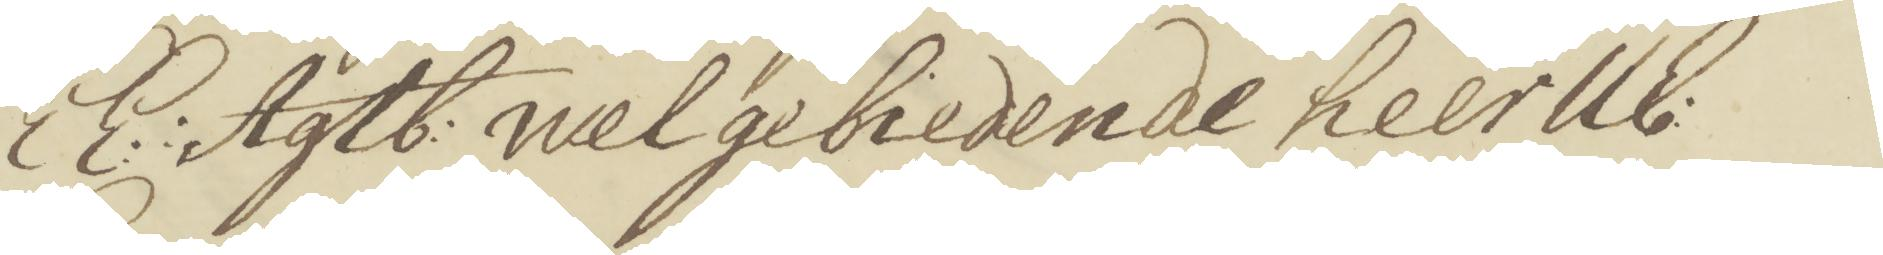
EE: Agtb: wel gebiedende heer UE:
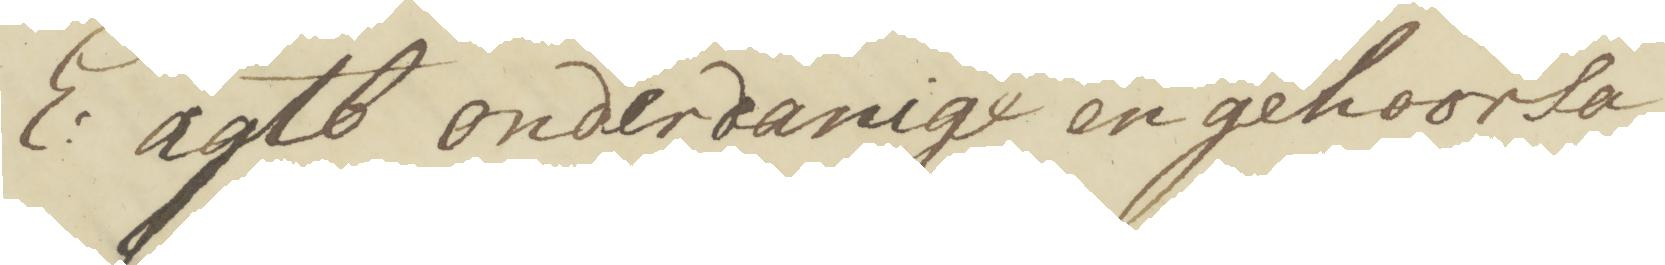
E: agtb onderdanige en gehoorsa
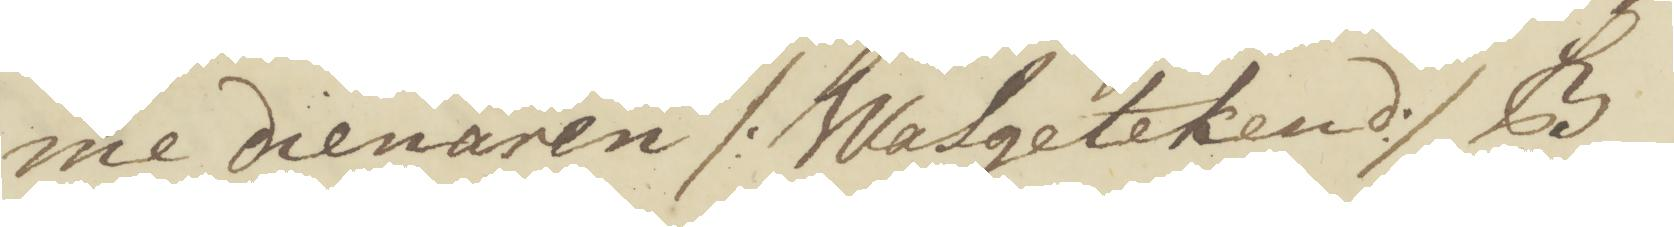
me dienaren /: Wasgetekend:/ B
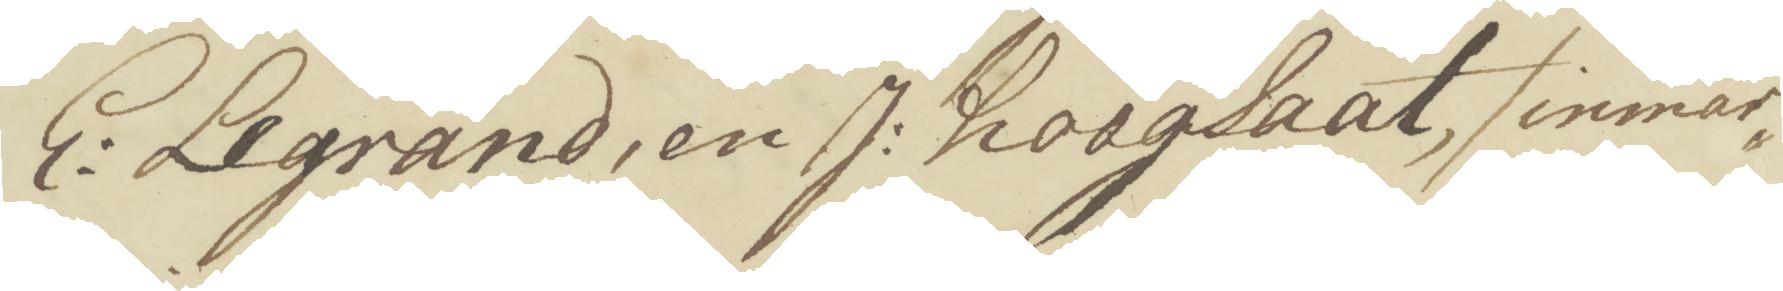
E: Legrand, en J: hoogsaat, / inmar„
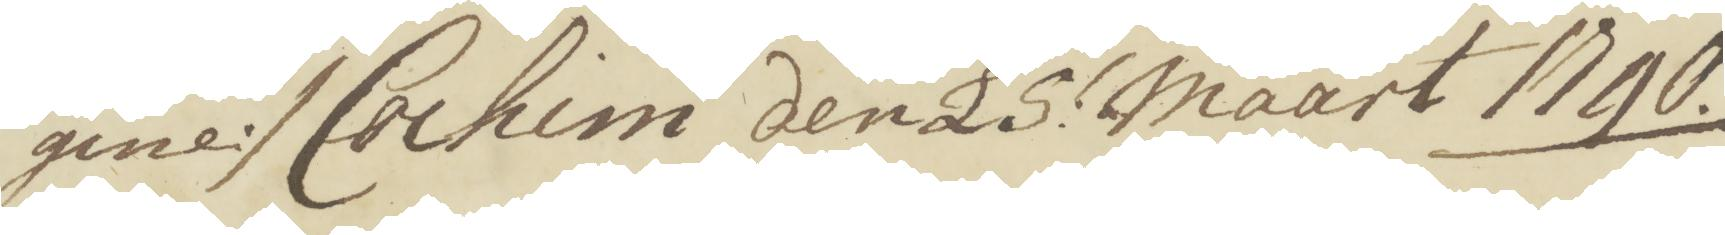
gine:/ Cochim den 25:' Maart 1740.
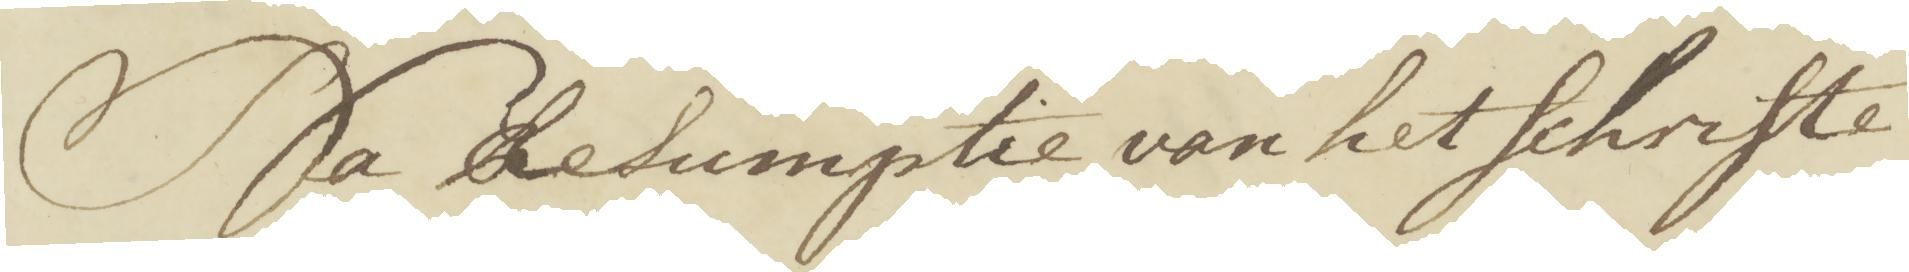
Na Resumptie van het schrifte
